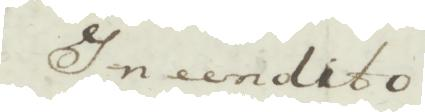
In een dito
